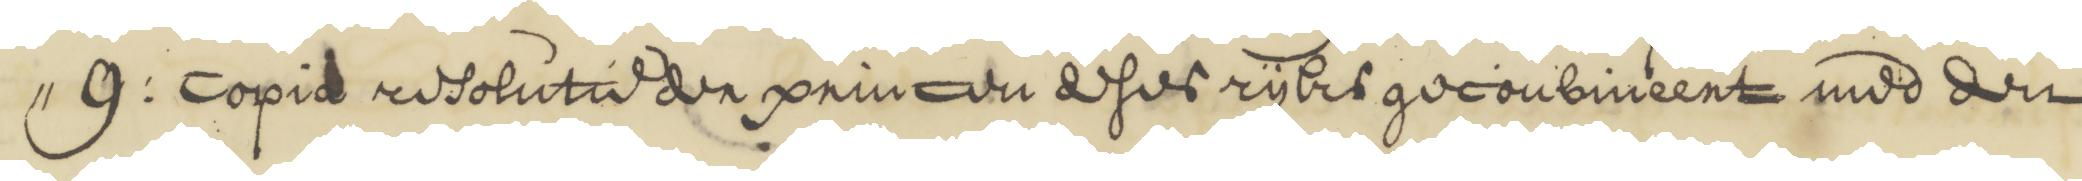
„9: Copia resolutie der princen deses rijks geconbineert med den
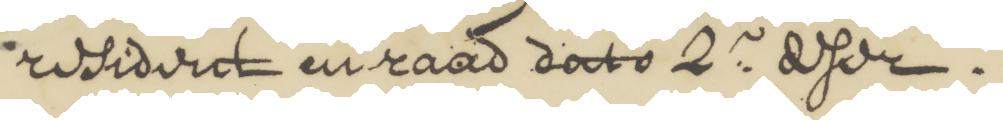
resident en raad dato 2:' deser.
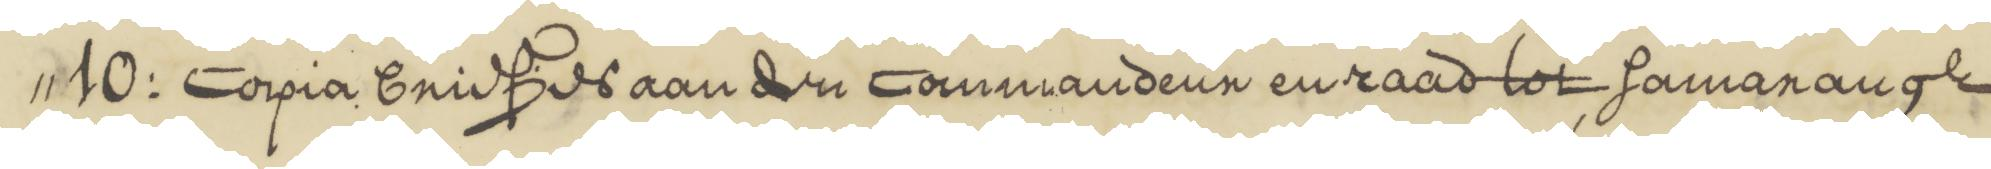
„10: Copia briefjes aan den commandeur en raad tot samarangh
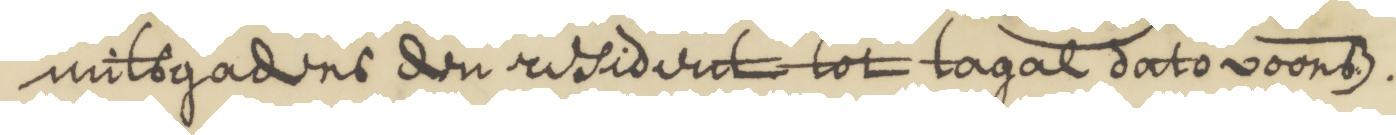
mitsgaders den resident tot tagal dato voors.
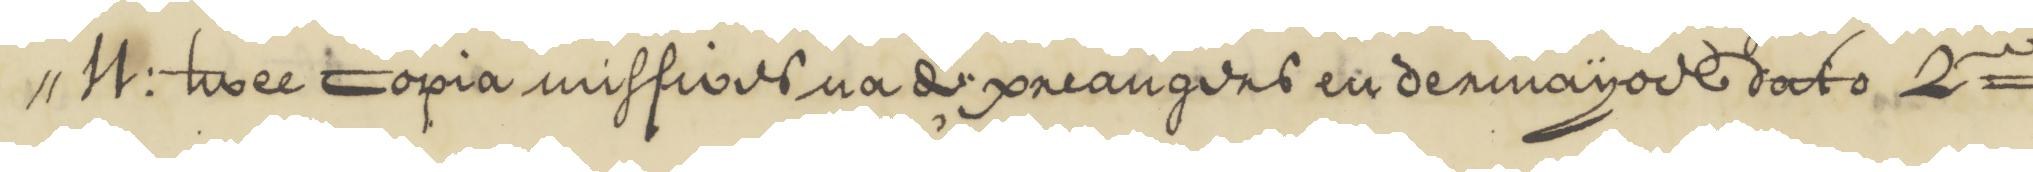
„ 11: twee Copia missives na de preangers en dermaijoe dato 2=e
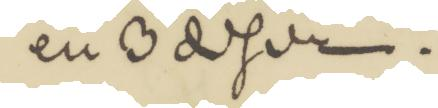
en 3' deser.
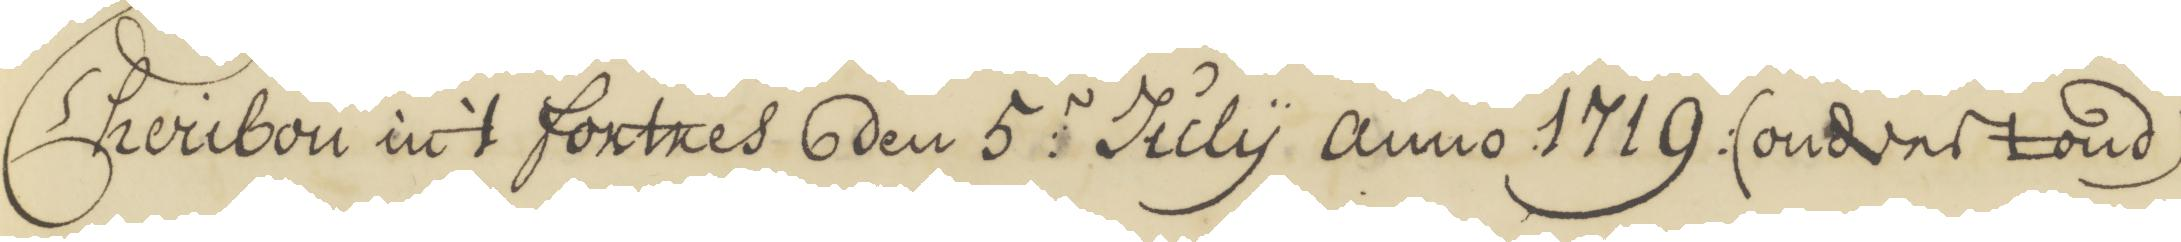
Cheribon in ’t fortres den 5:e Julij Anno 1719: (onderstond)
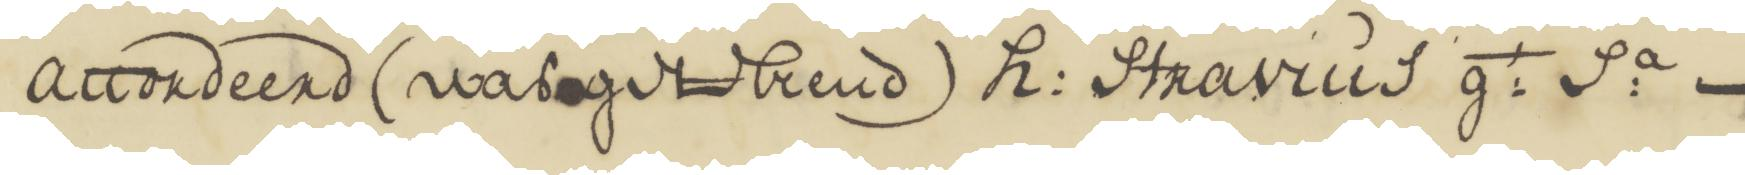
accordeerd (was getekend) h: Stravius g:t s:a
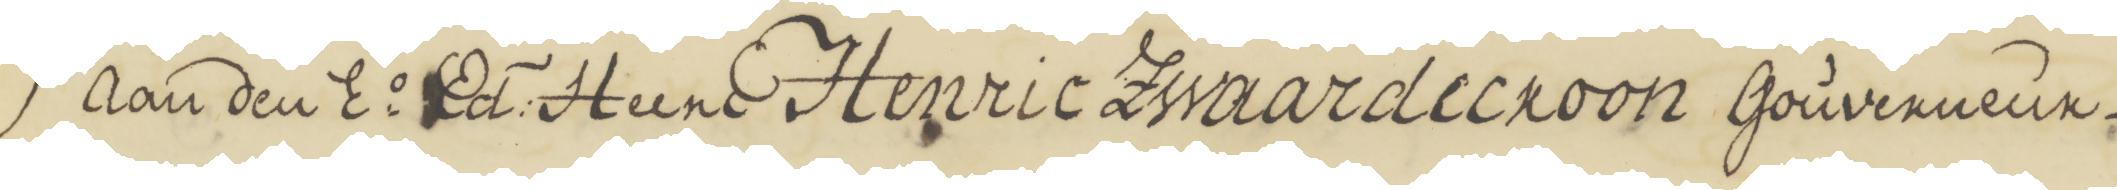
Aan den h:o Ed:' Heere Henric Zwaardecroon gouverneur
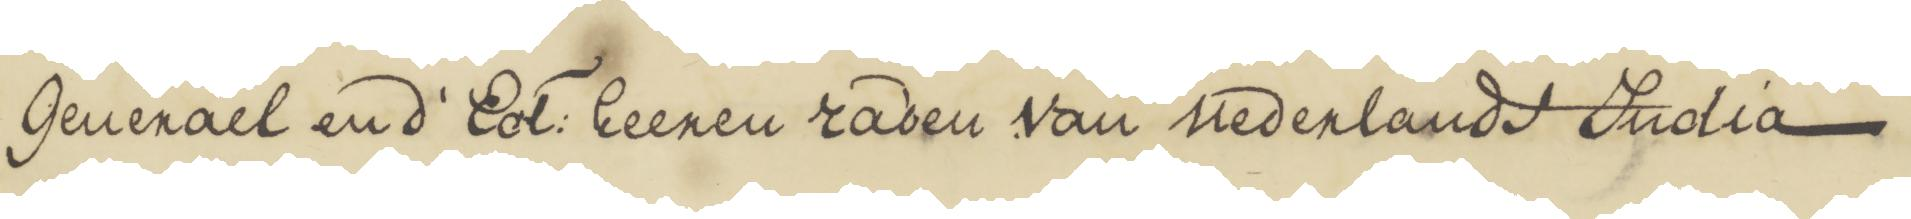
Generael en d’ Ed: heeren raden van nederlands India.
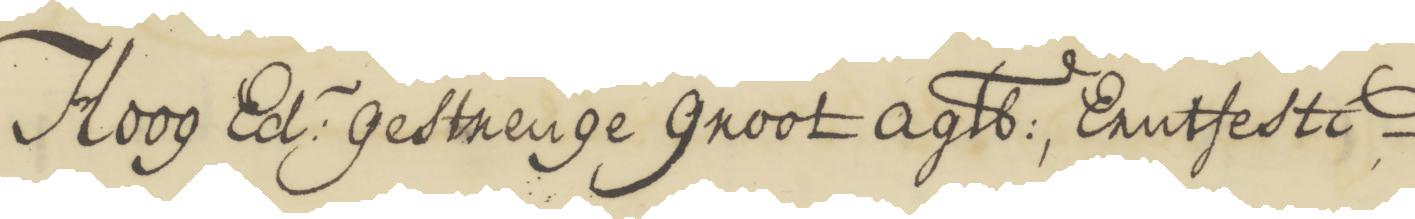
Hoog Ed:' gestrenge groot agtb:, Erntfeste
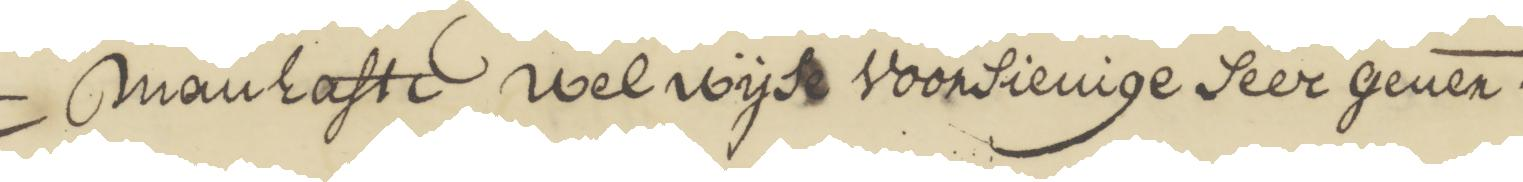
manhafte wel wijse voorsienige seer gener:
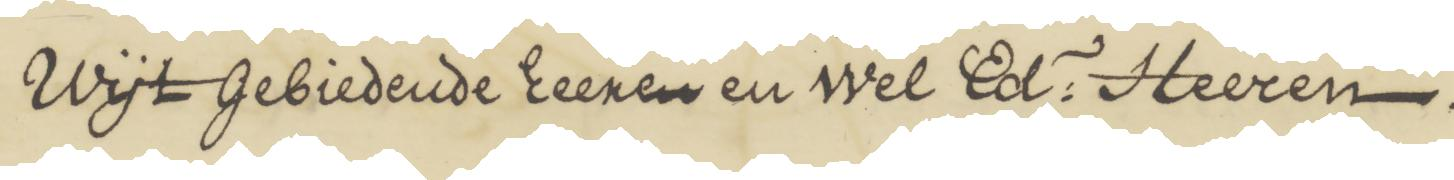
wijt gebiedende heeren en wel Ed:' Heeren.
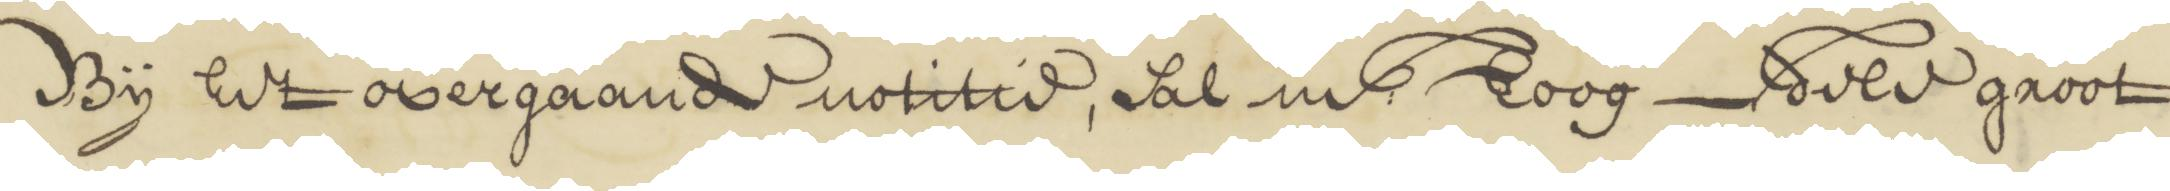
Bij het overgaande notitie, sal uE: hoog Edele groot
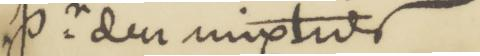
p„r den mixties
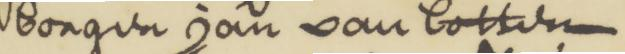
borger jan van botten
